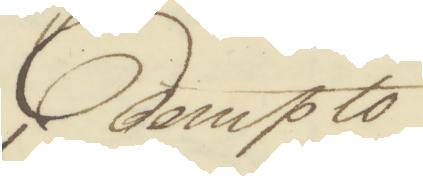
dempto
